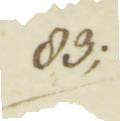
83;
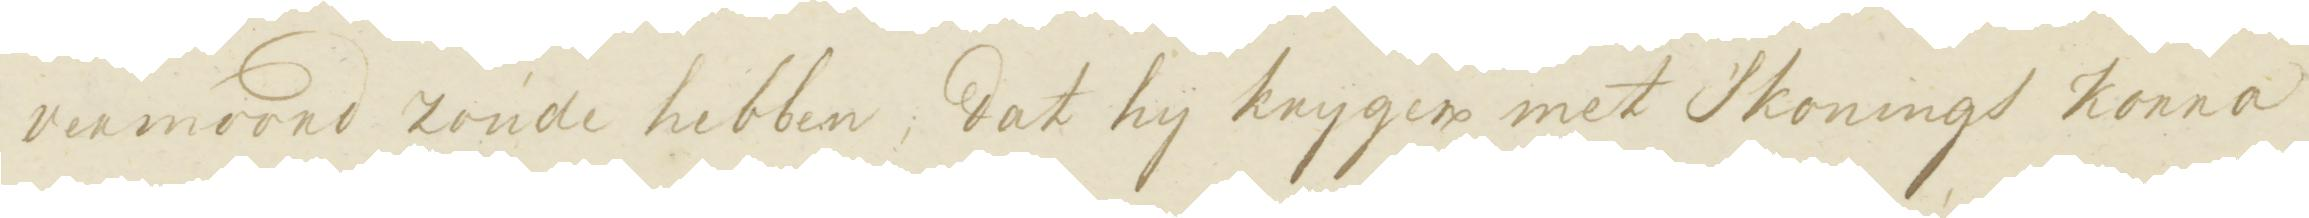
vermoord zoude hebben; dat hij krijger met 's konings korra
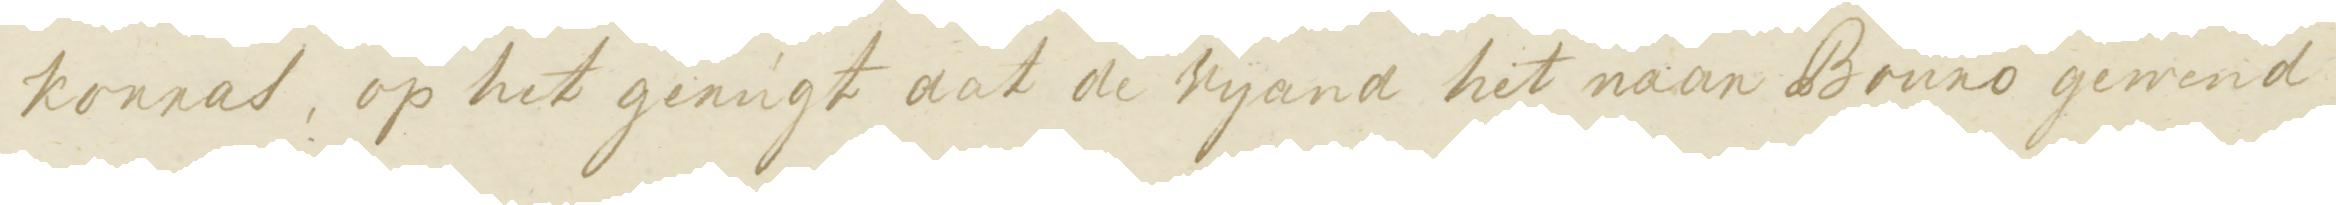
korras, op het gerugt dat de vijand het naar Bouro gewend
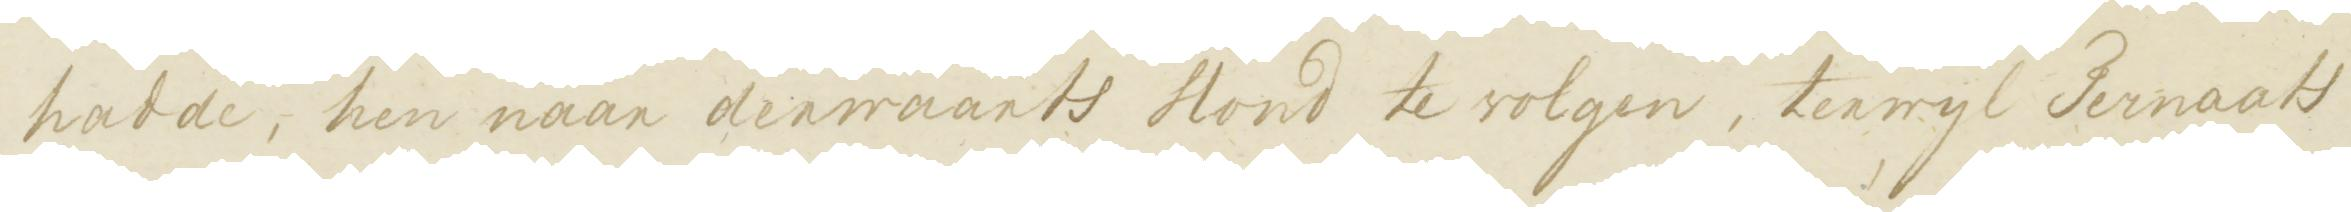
hadde, hen naar derwaarts stond te volgen, terwijl Ternaats
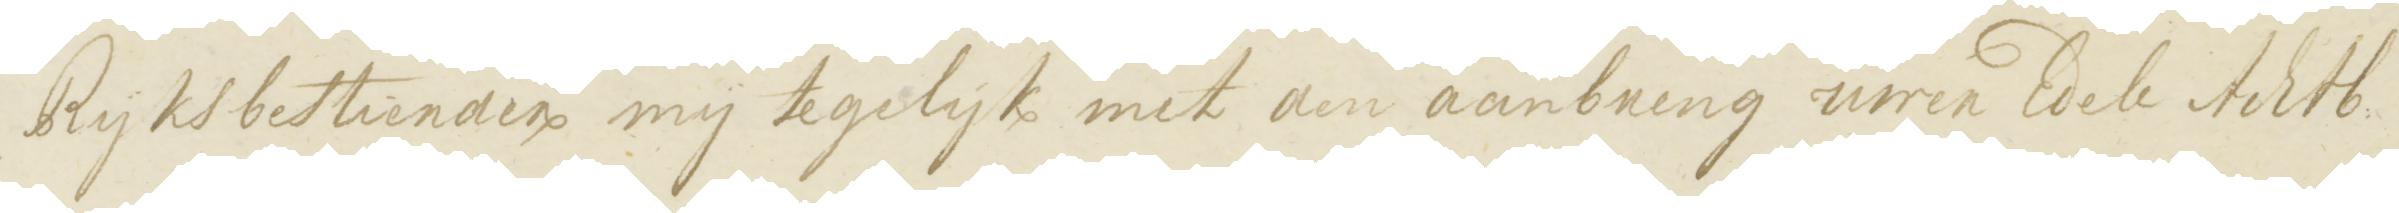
Rijksbestierder mij tegelijk met den aanbreng uwer Edele Achtb:
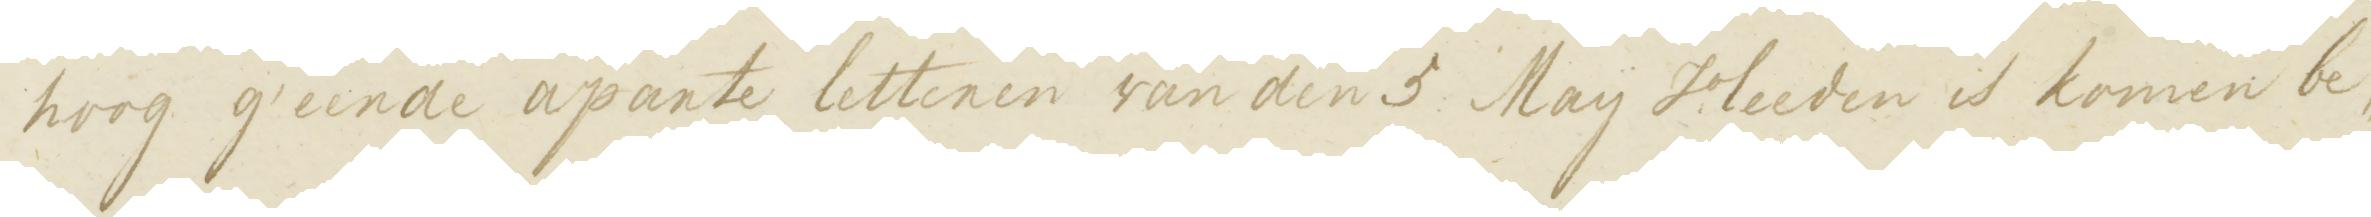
hoog g’eerde aparte letteren van den 5: Maij Heeden is komen be
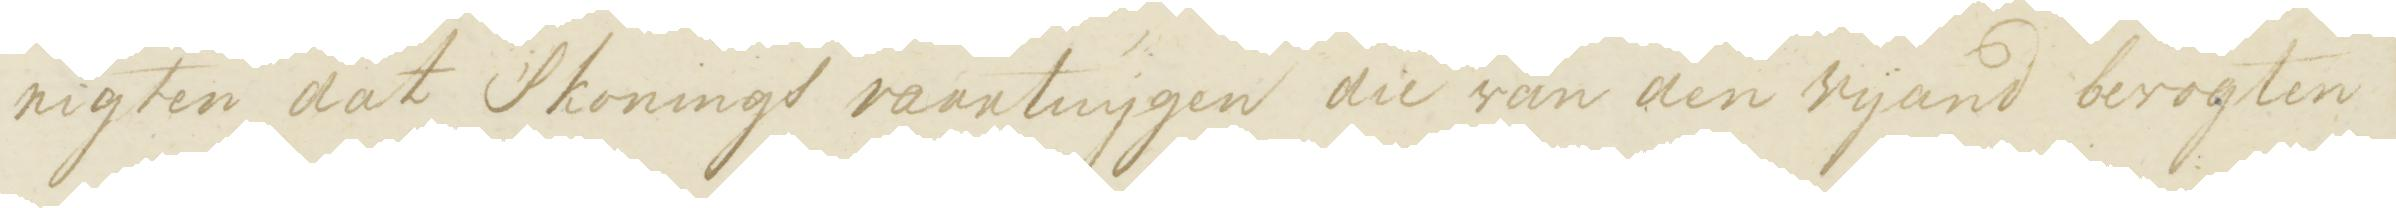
rigten dat 's konings vaartuijgen die van den vijand bevogten
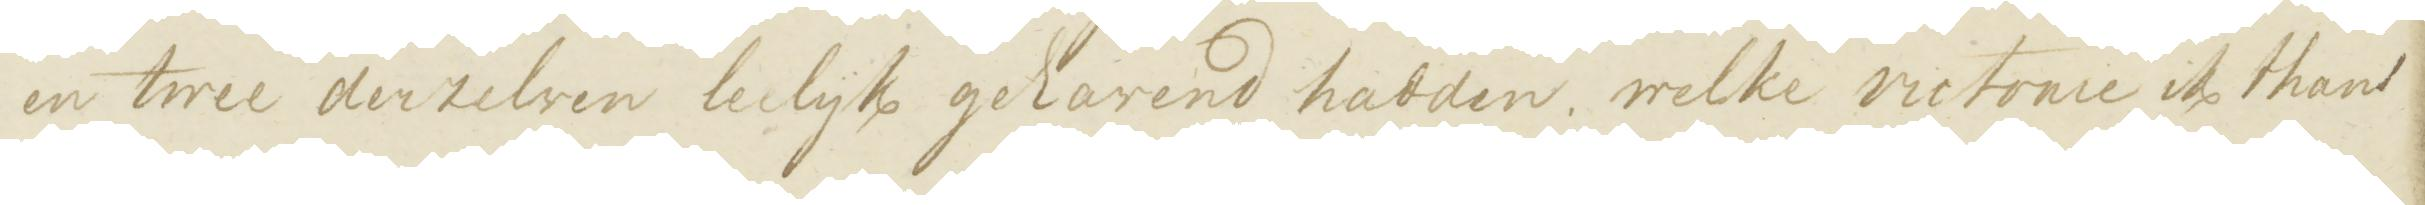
en twee derzelven leelijk gehavend hadden, welke victorie ik thans
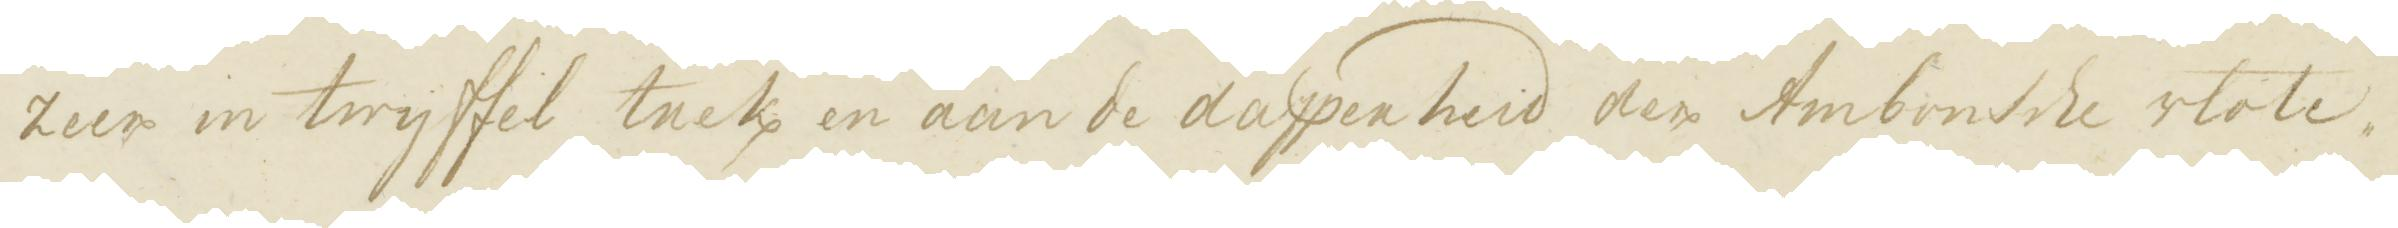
zeer in twijffel trek en aan de dapperheid der Ambonsche vlote„
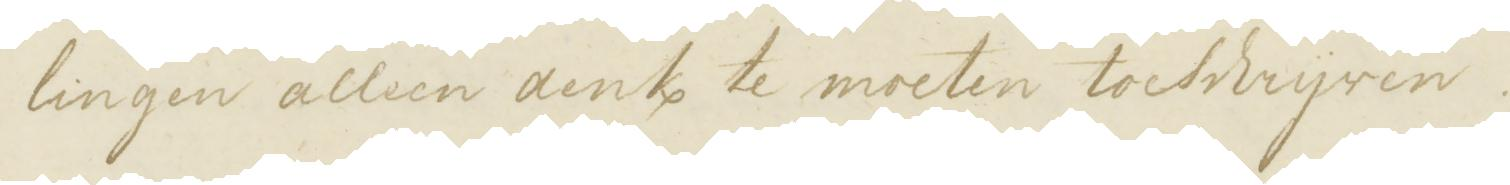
lingen alleen denk te moeten toeschrijven
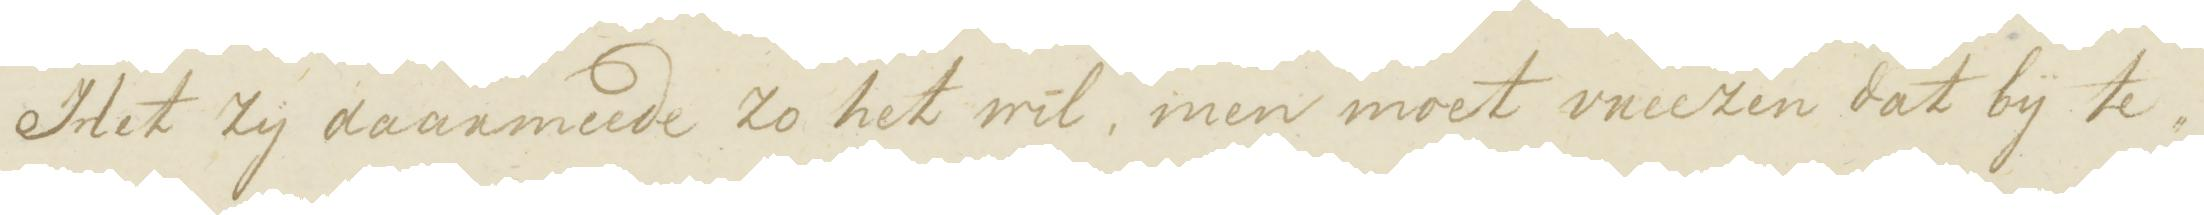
Het zij daarmeede zo het wil, men moet vreezen dat bij te „
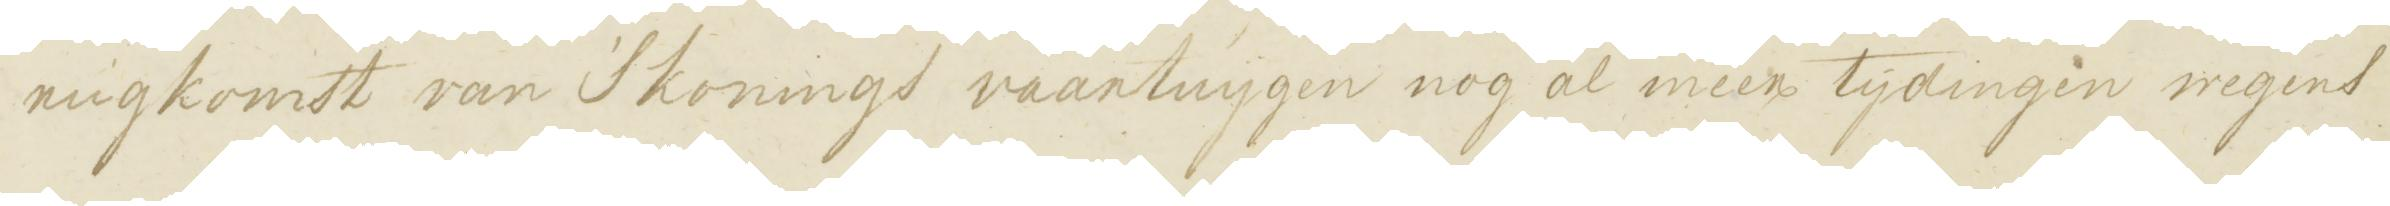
rugkomst van 's konings vaartuijgen nog al meer tijdingen wegens
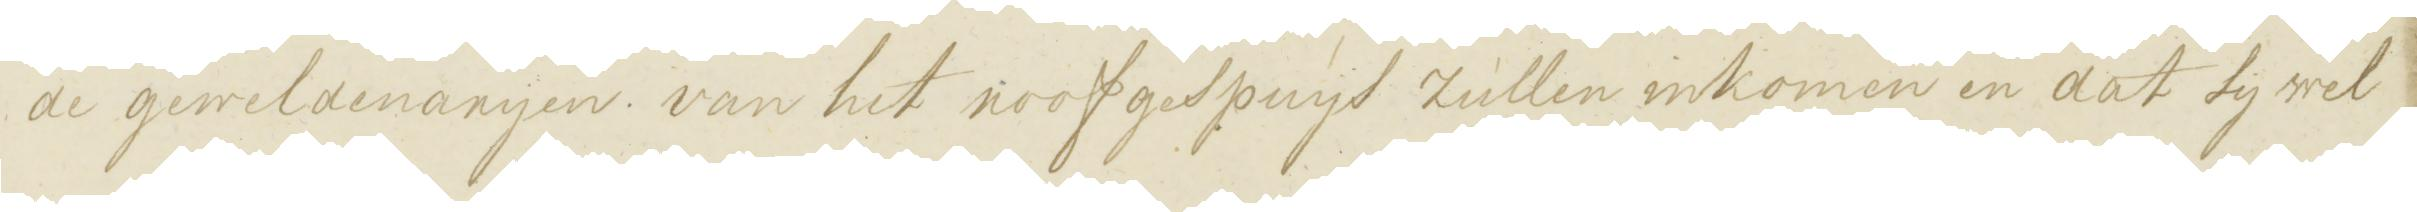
de geweldenarijen van het roofgespuijs zullen inkomen en dat sij wel
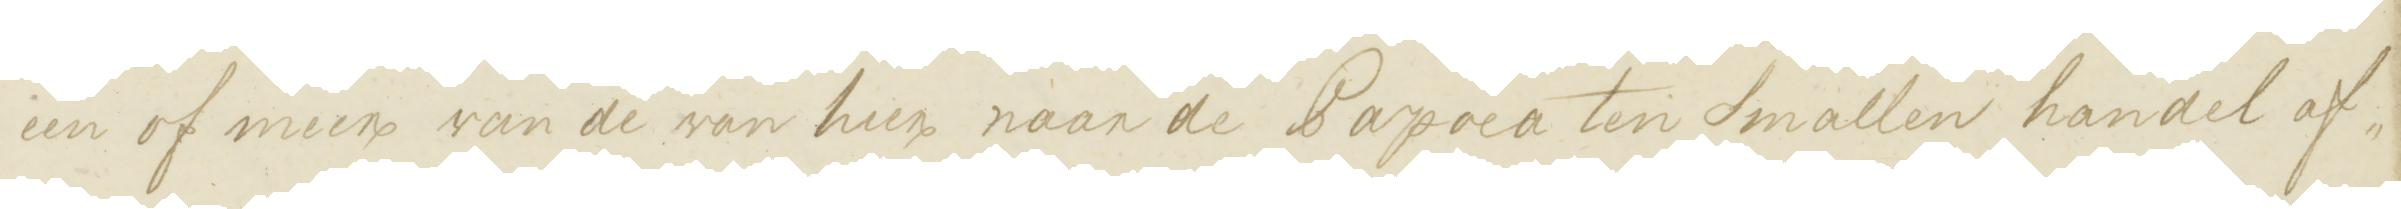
een of meer van de van hier naar de Papoea ten smallen handel af„
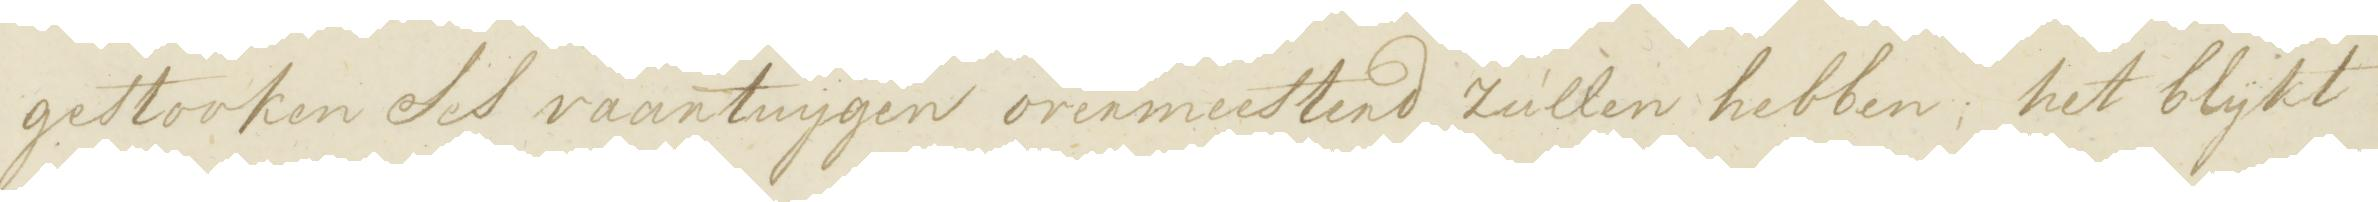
gestooken ses vaartuijgen overmeesterd zullen hebben; het blijkt
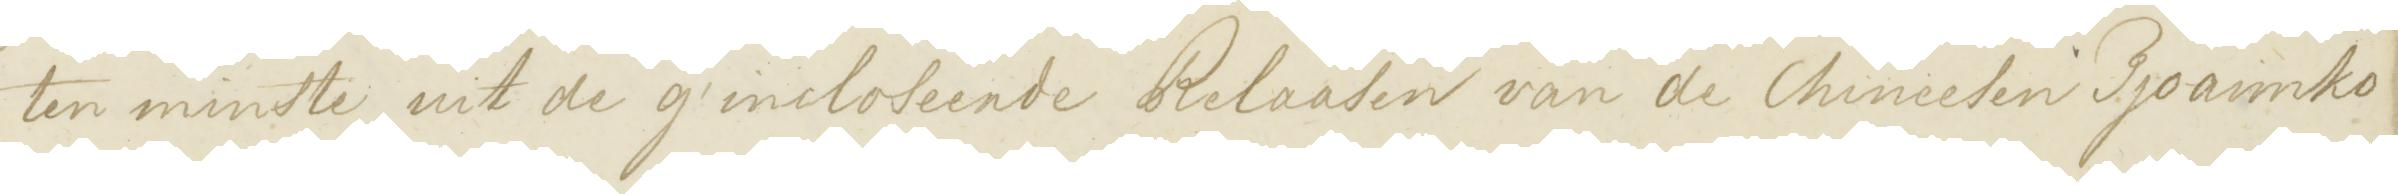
ten minste uit de g’incloseerde Relaasen van de Chineesen Tjoaimko
